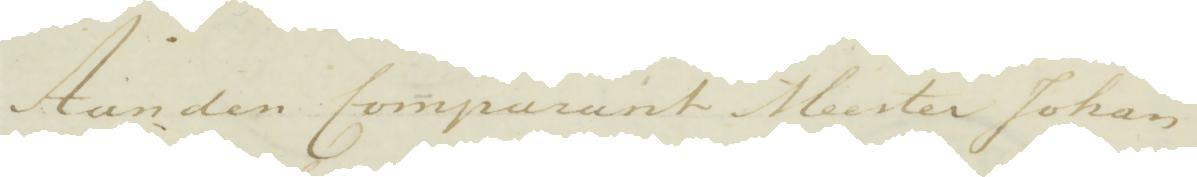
Aan den Comparant Meester Johan
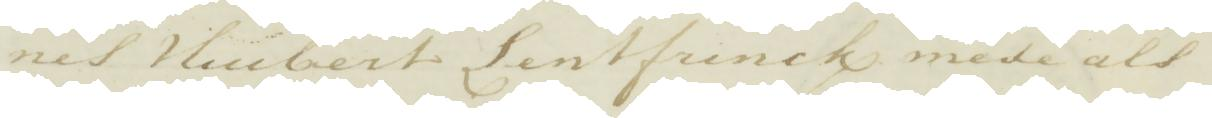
nes Huibert Lentfrinck mede als
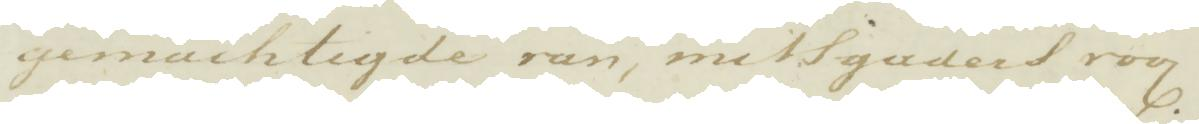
gemachtigde van, mitsgaders voor
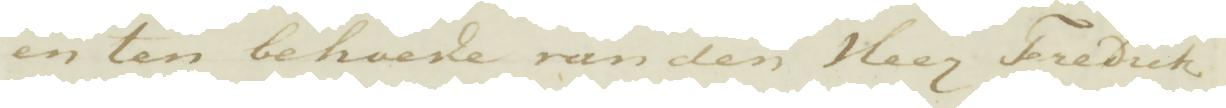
en ten behoeve van den Heer Fredrik
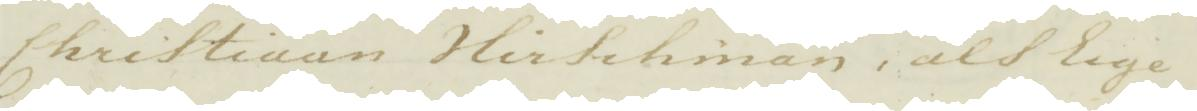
Christiaan Hirschman, als Eige
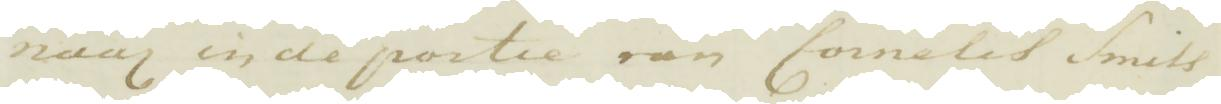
naar in de portie van Cornelis Smits
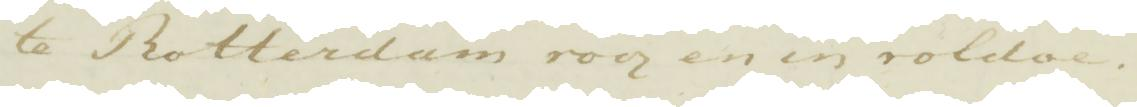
te Rotterdam voor en in voldoe.
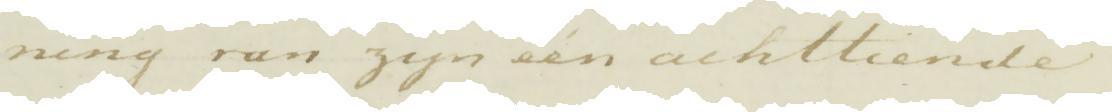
ning van zyn één achttiende
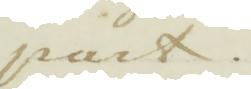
part.
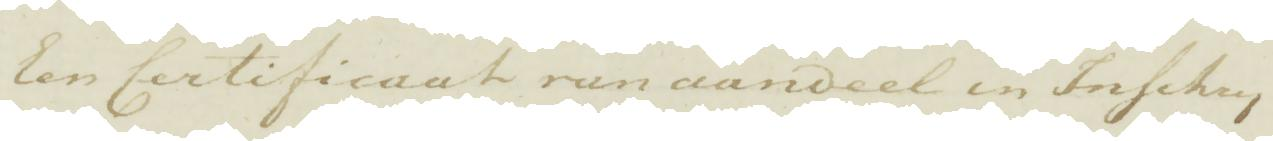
Een Certificaat van aandeel in Inschry
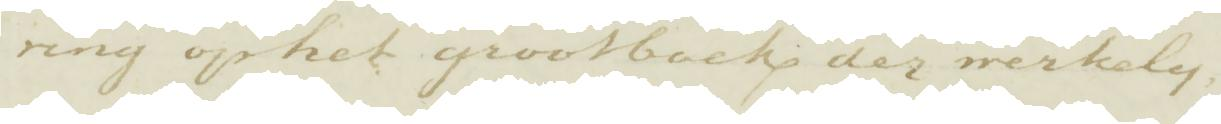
ving op het grootboek der werkely„
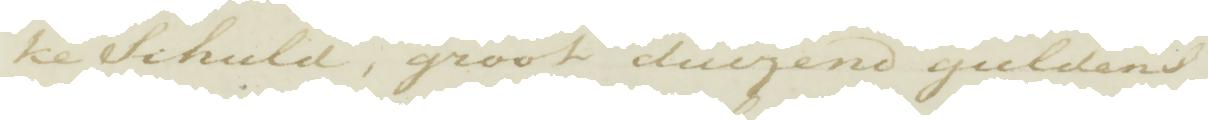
ke schuld, groot duizend guldens
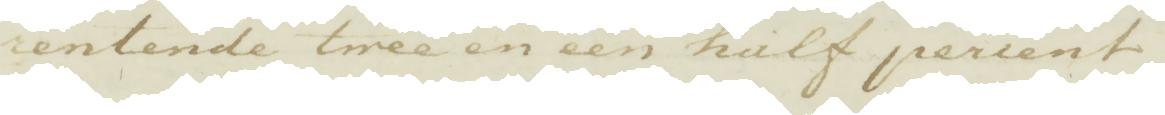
rentende twee en een half percent
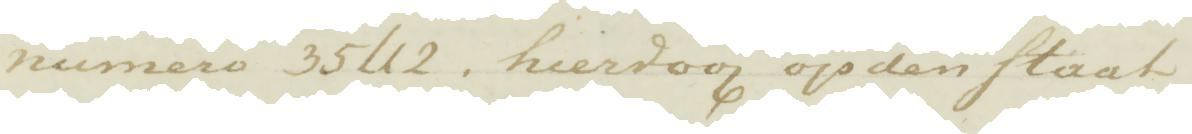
numero 3542, hiervoor op den staat
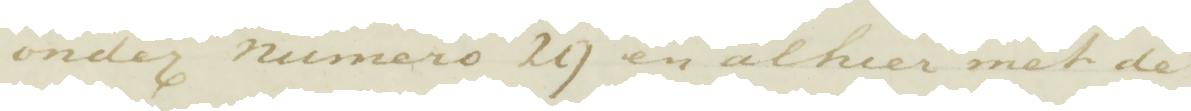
onder numero 29 en alhier met de
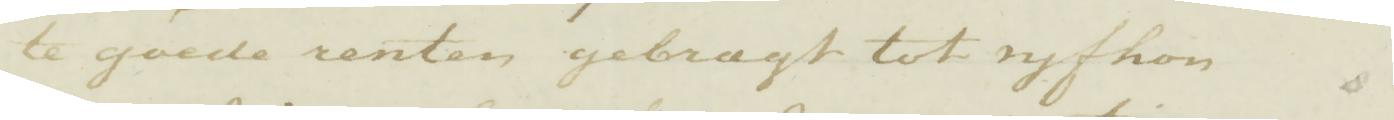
te goede renten gebragt tot vyfhon
